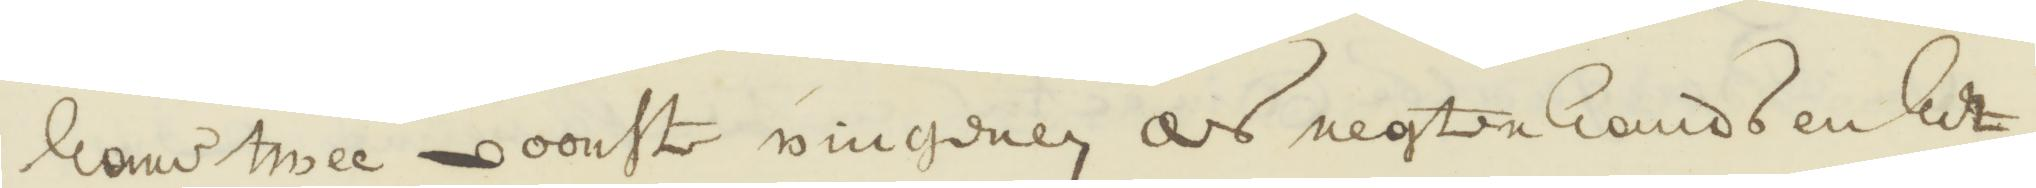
hare twee voorste vingeren des regterhands en het
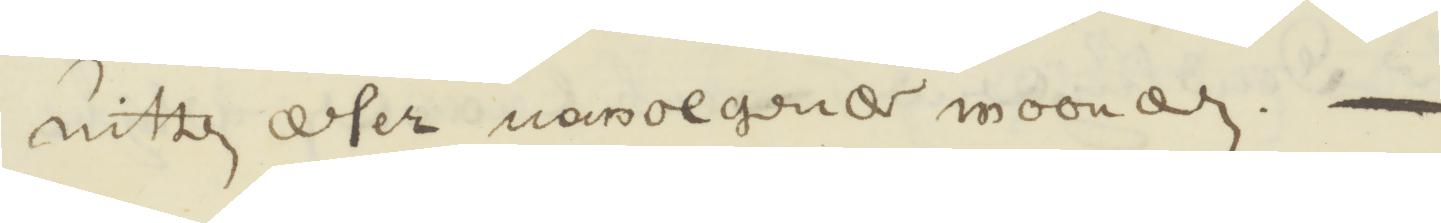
uitten deser navolgende woorden.
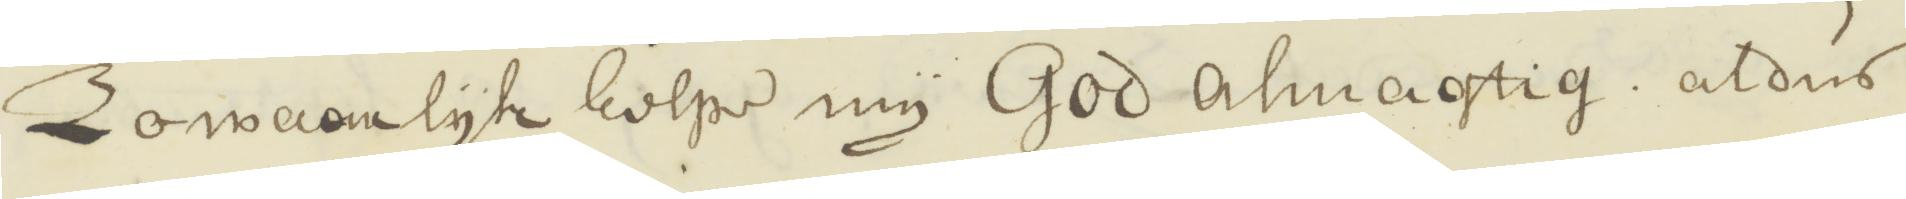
Zowaarlijk helpe mij God almagtig. aldus
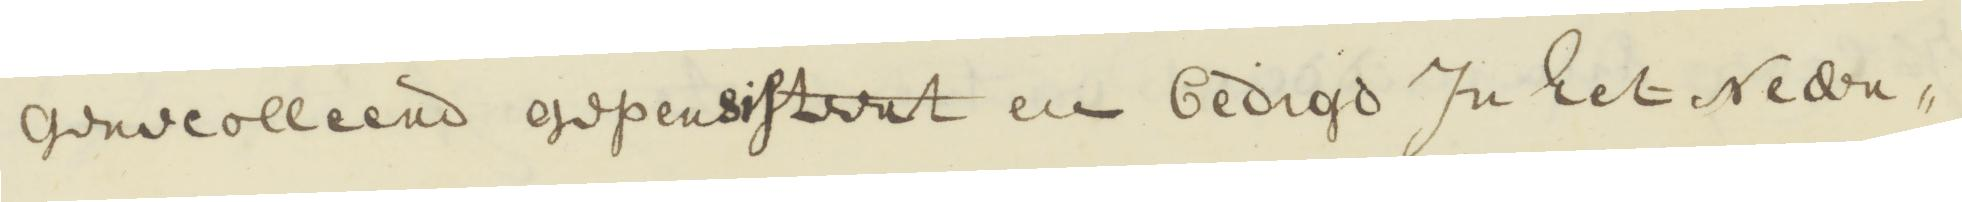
gerecolleerd gepersisteert en bedigd Jn het Neder„
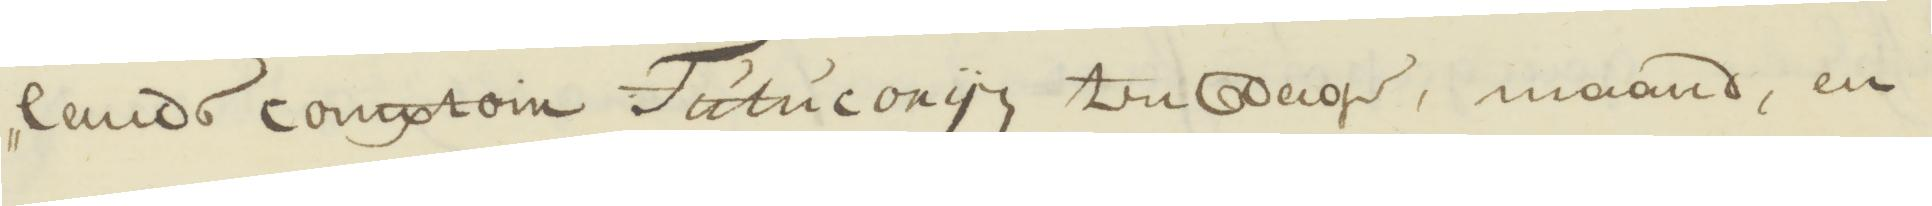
„lands comptoir Tutucorijn ten dage, maand, en
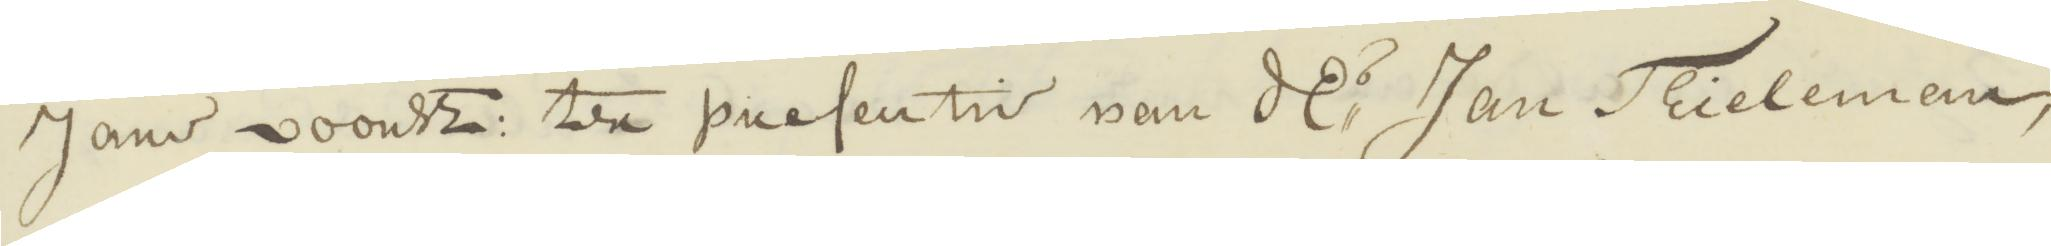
Jare voorsz: ter presentie van dE„s Jan Thieleman,
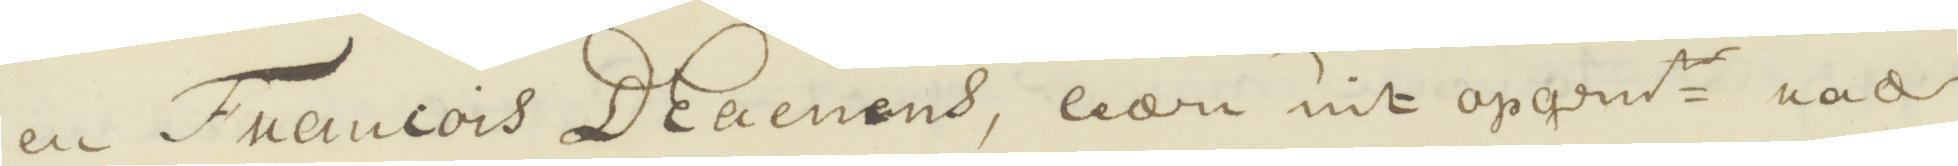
en Francois Dhaenens, leden uit opgem=te rade
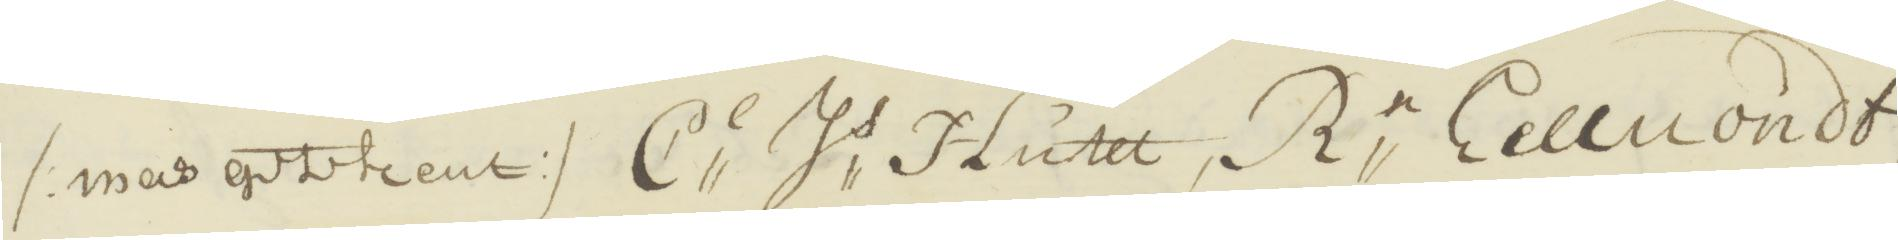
/:was getekent:/ C„l J„s Hutet, R„r helmoudt,
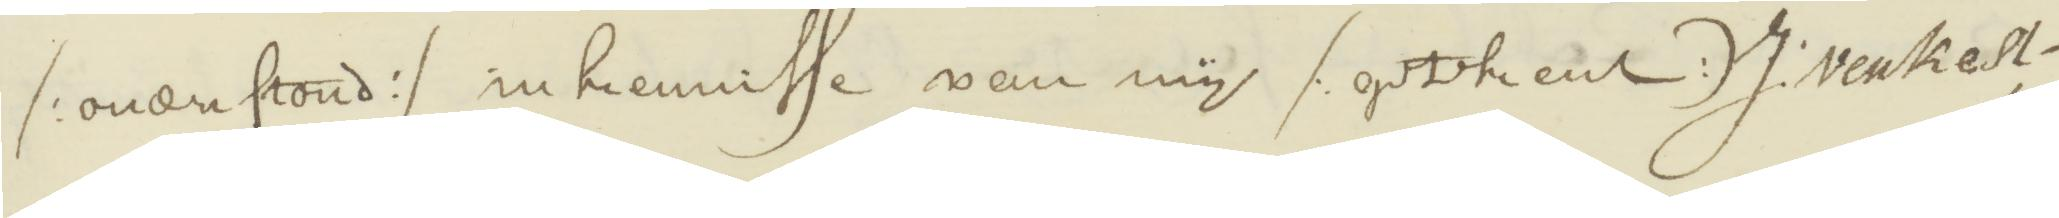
/:onderstond:/ in kennisse van mij /:getekent:) J: verkest,
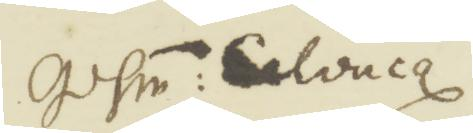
gesw: Clercq
